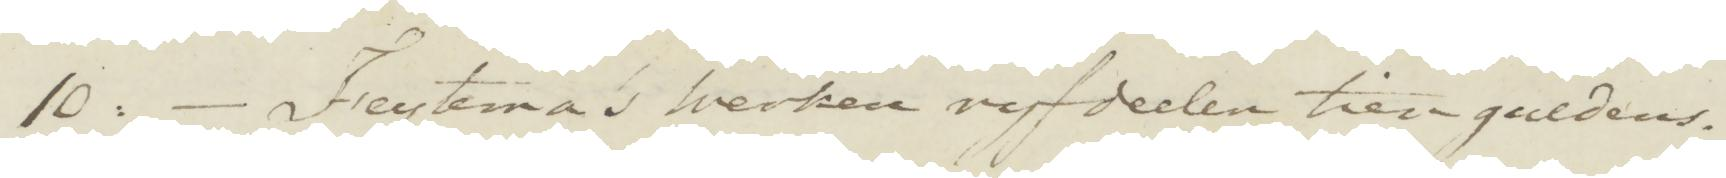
10:— Feytema's werken vyf deelen tien guldens.
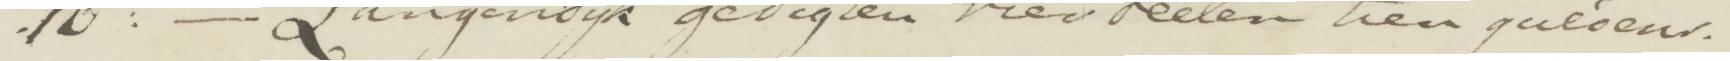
10:— Langendyk gedigten vier deelen tien guldens.
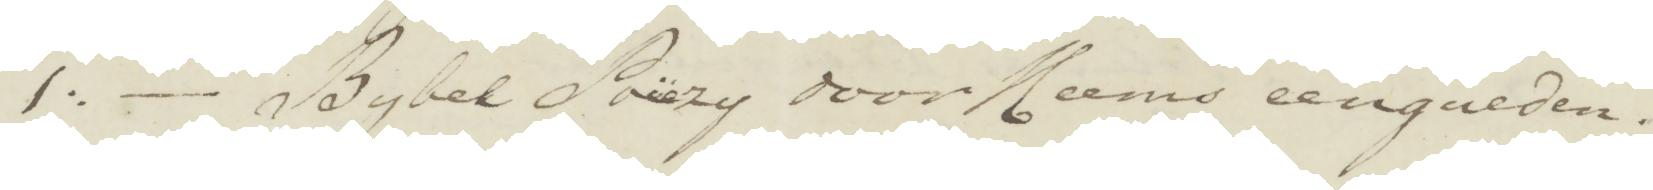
1:— Bybel Poeëzy door Heems een gulden.
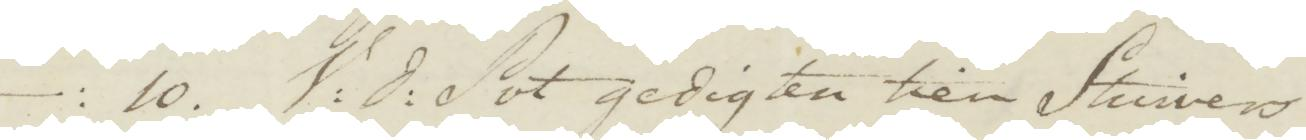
— : 10. V:d: Pot gedigen tien Stuivers
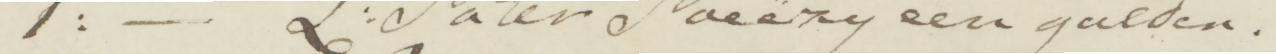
1: — L: Pater Poeëzy een gulden.
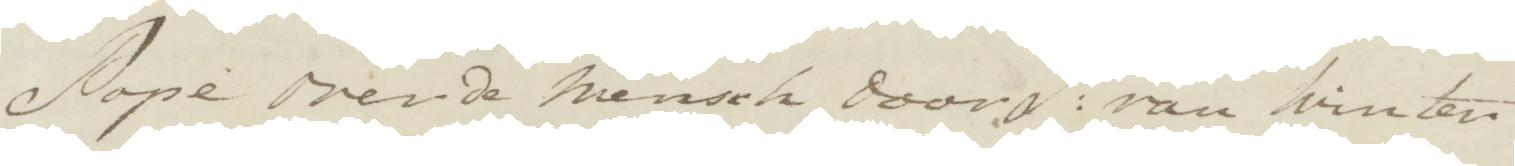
Pope over de mensch door P: van winter
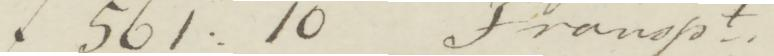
ƒ 561: 10 Transp-t.
